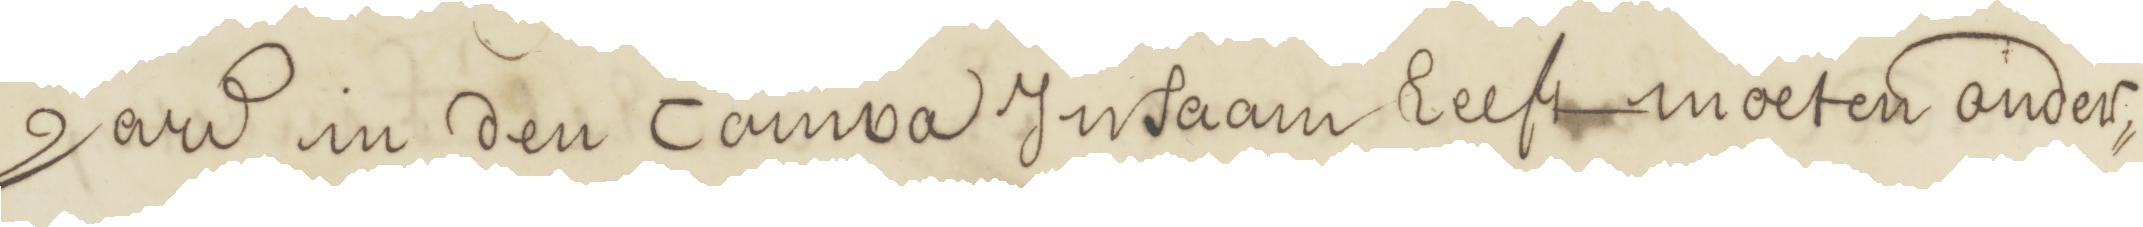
jare in den Cauwa Insaam heeft moeten onder„
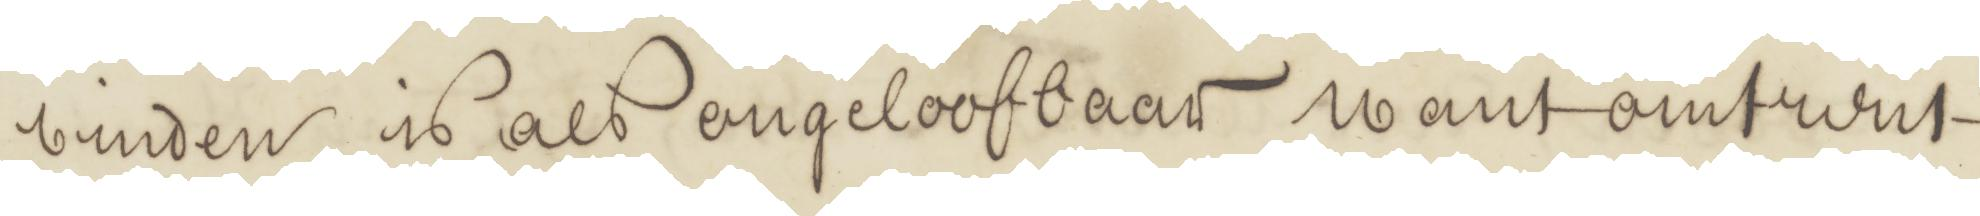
vinden, is als ongeloofbaar want omtrent
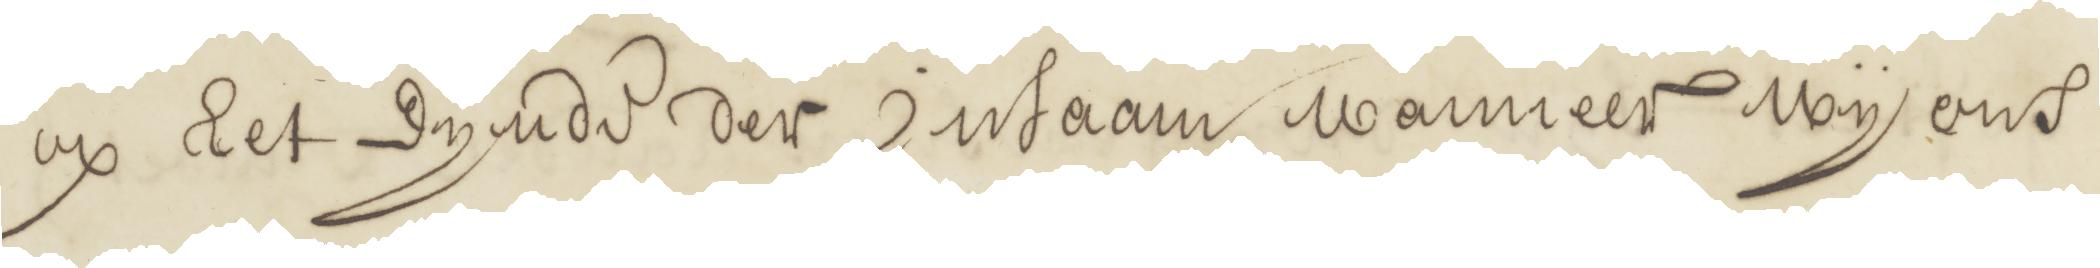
op het Eijnde der jnsaam wanneer wij ons
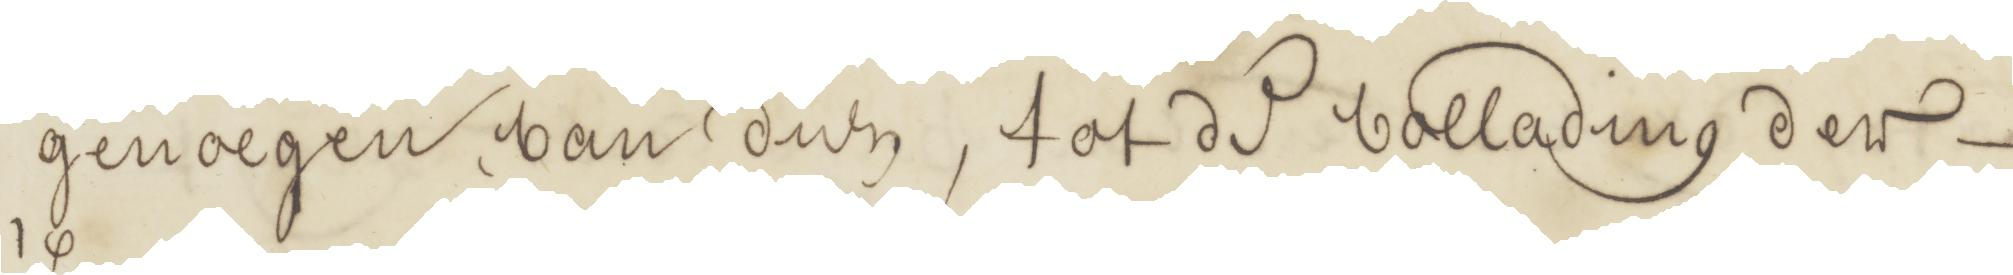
genoegen van dien, tot de vollading der
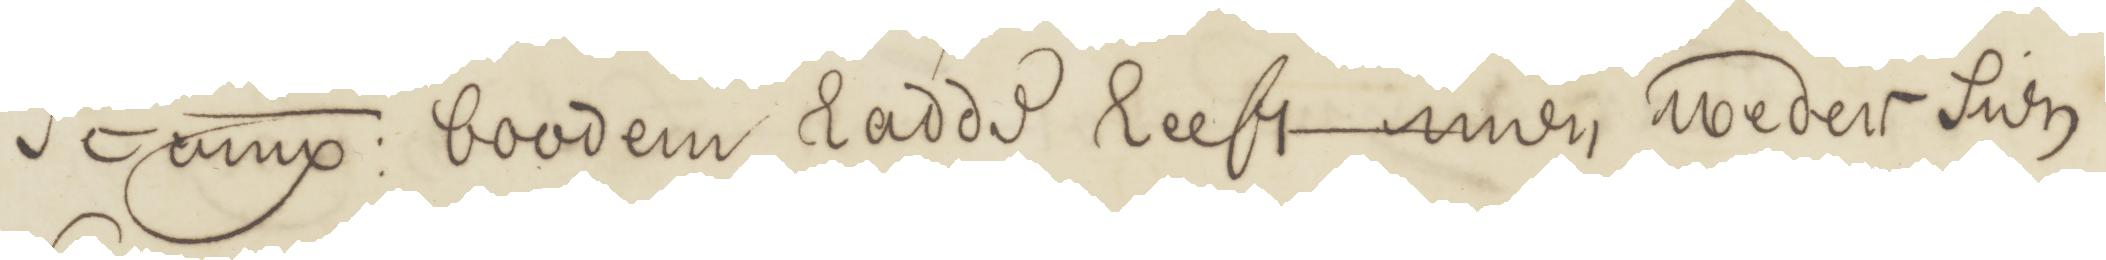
's comp: boodem hadde heeft men weder sien
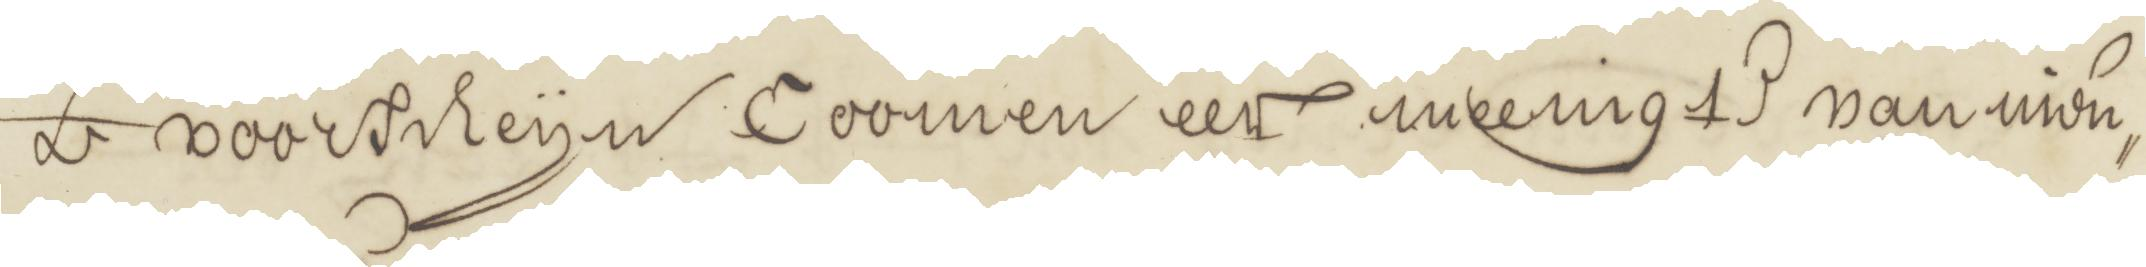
te voorscheijn coomen eer meenig te van nieu„
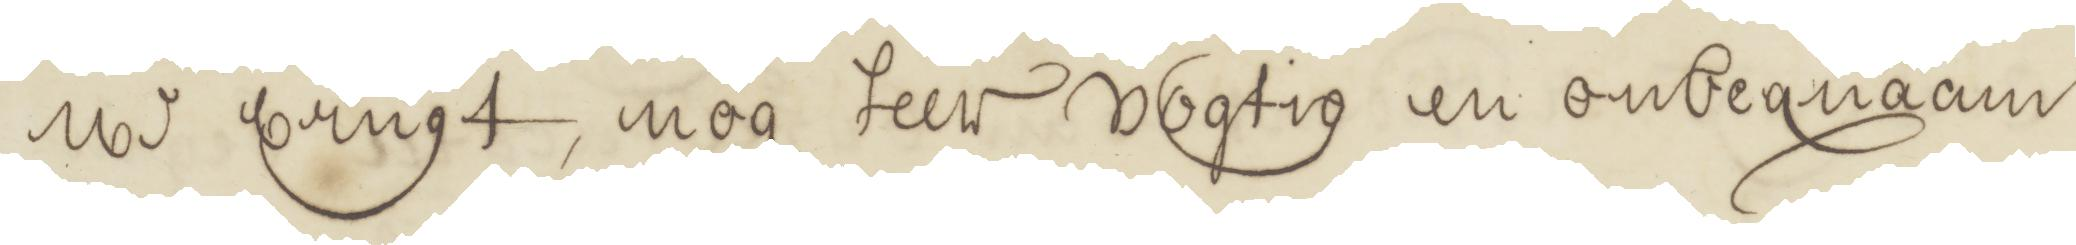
we vrugt, nog seer vogtig en onbequaam
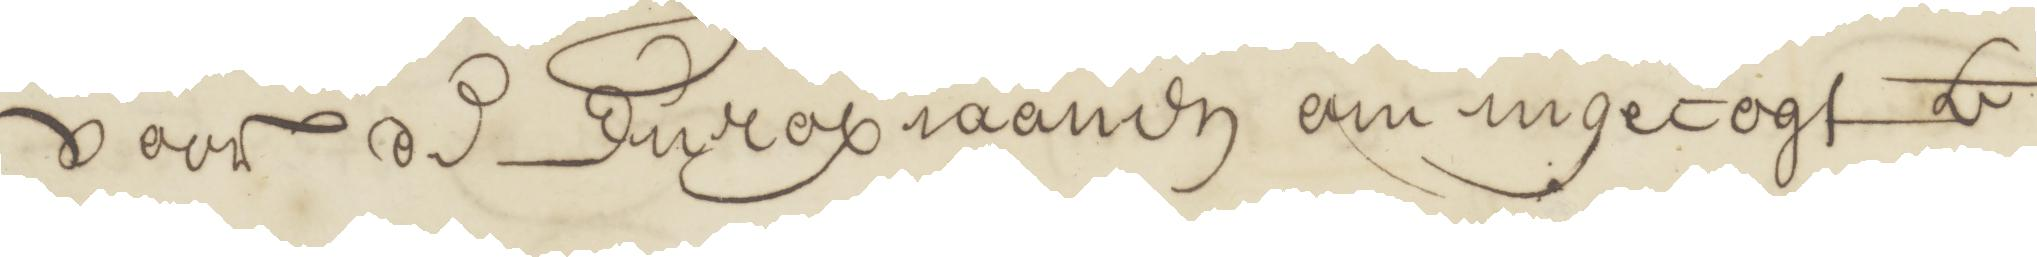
voor de Europiaanen om ingecogt te
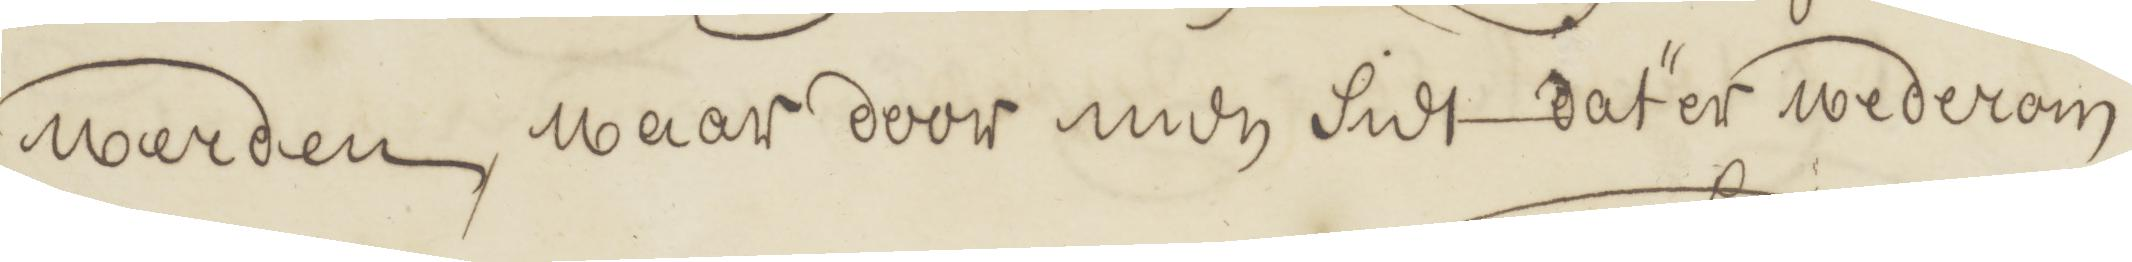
werden, waar door men siet dat "er wederom
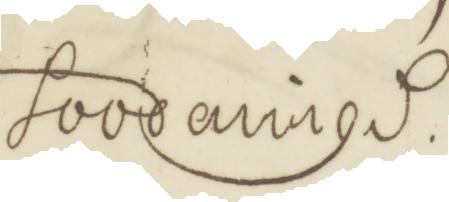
soodaninge
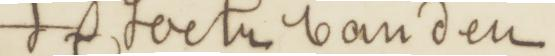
t versoek van den
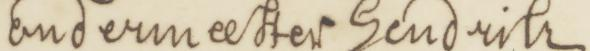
ondermeester hendrik
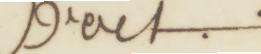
Voet.
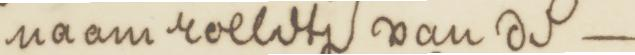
naam rolletje van de —
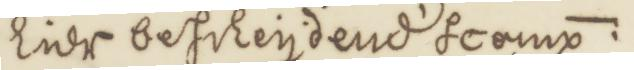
hier bescheijdene 'scomp:
